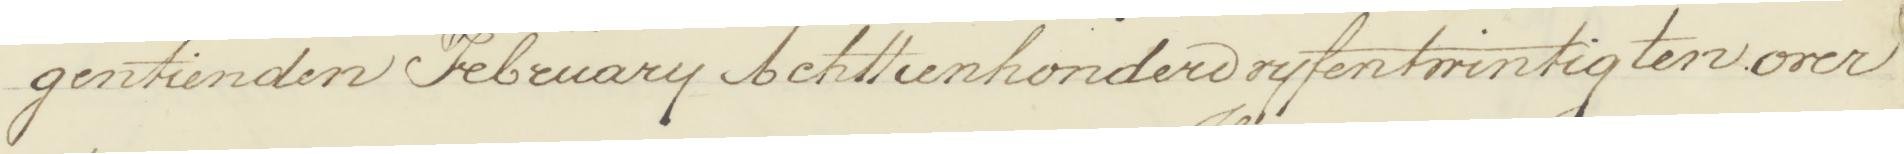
gentienden February Achttienhonderd vyfentwintig ten over
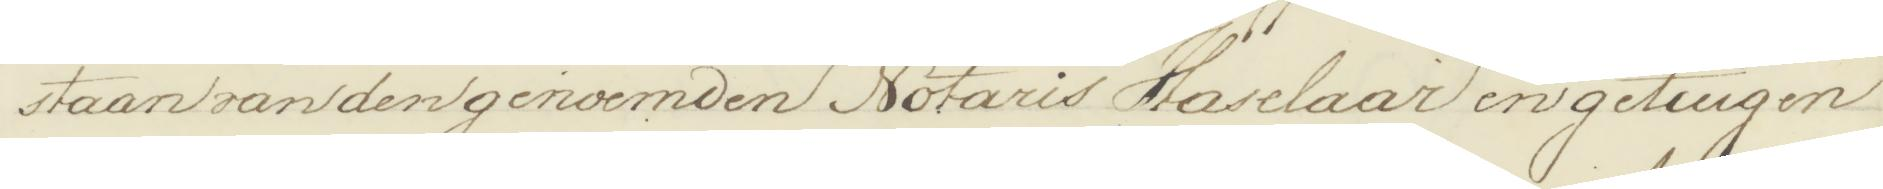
staan van den genoemden Notaris Haselaar en getuigen
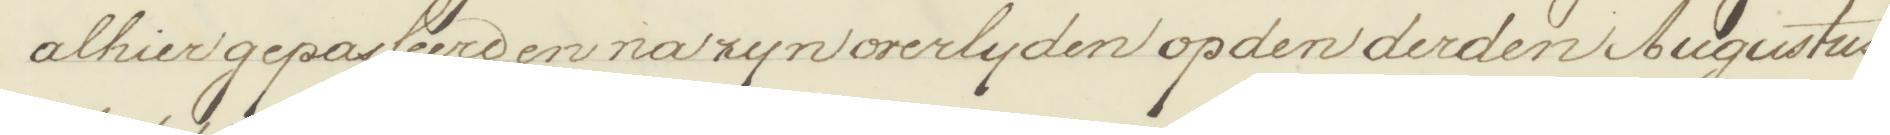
alhier gepasseerd en na zyn overlijden op den derden Augustus
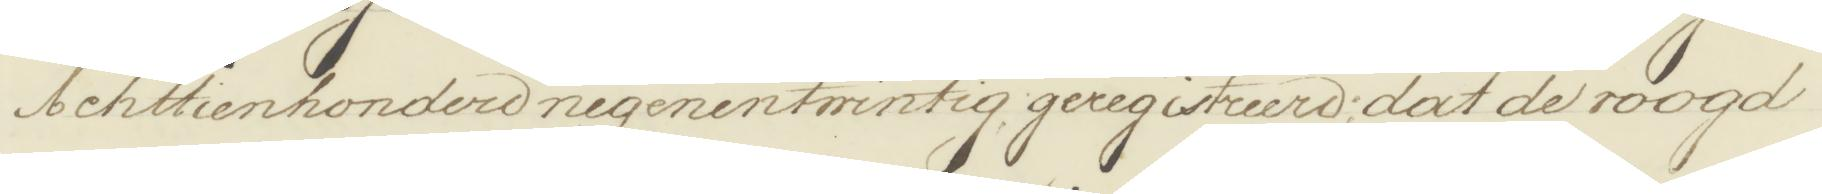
Achttienhonderd negenentwintig geregistreerd; dat de voogd
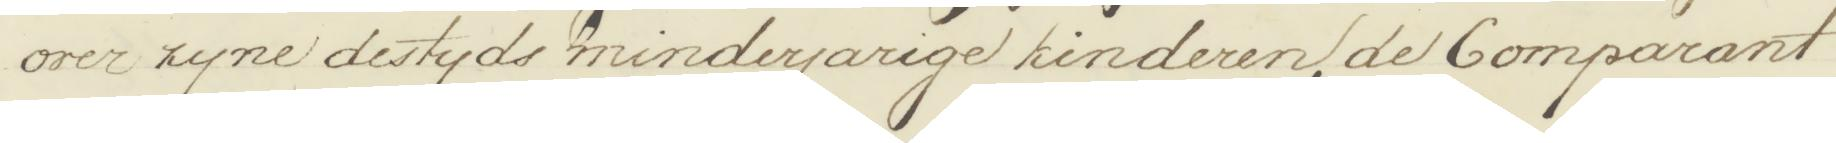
over zyne destijds minderjarige kinderen, de Comparant
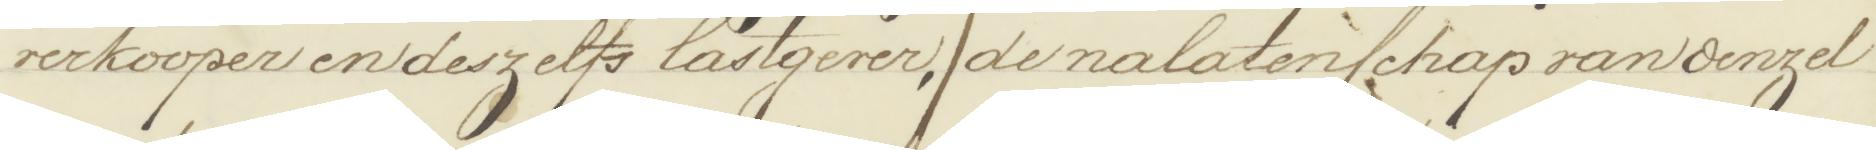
verkooper en deszelfs lastgever, /de nalatenschap van denzel
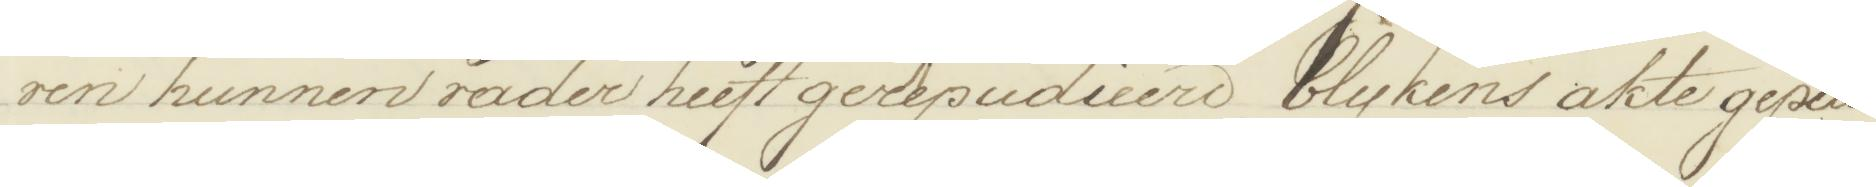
ven hunnen vader heeft gerepudieerd, blykens akte gepas
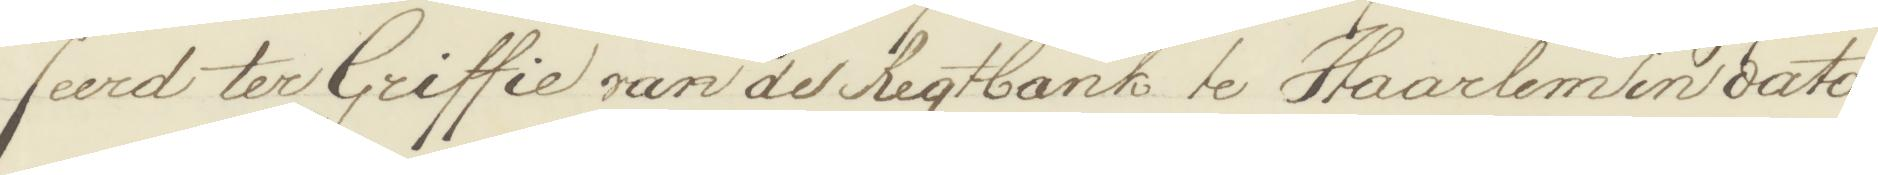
seerd ter Griffie van de Regtbank te Haarlem in dato
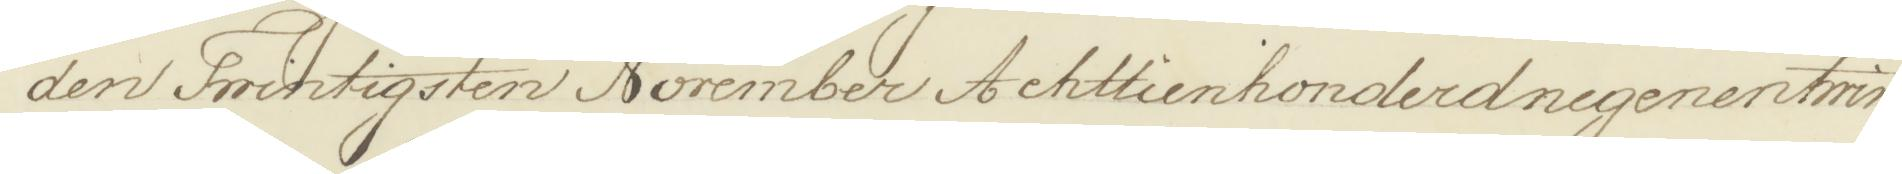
den Twintigsten November Achttienhonderd negenentwin
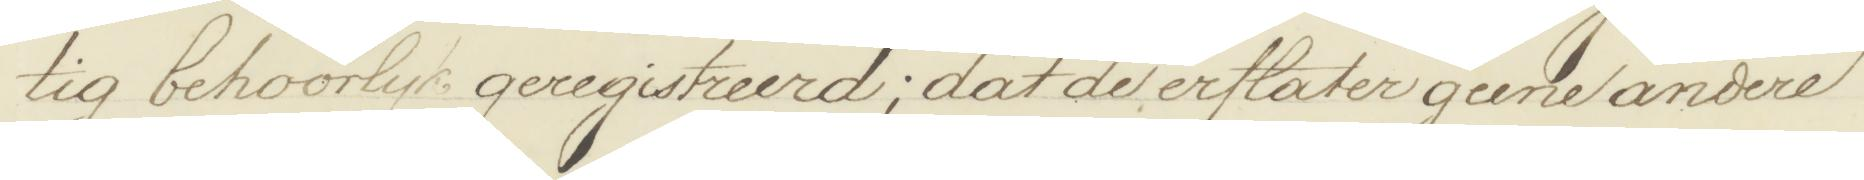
tig behoorlyk geregistreerd; dat de erflater geene andere
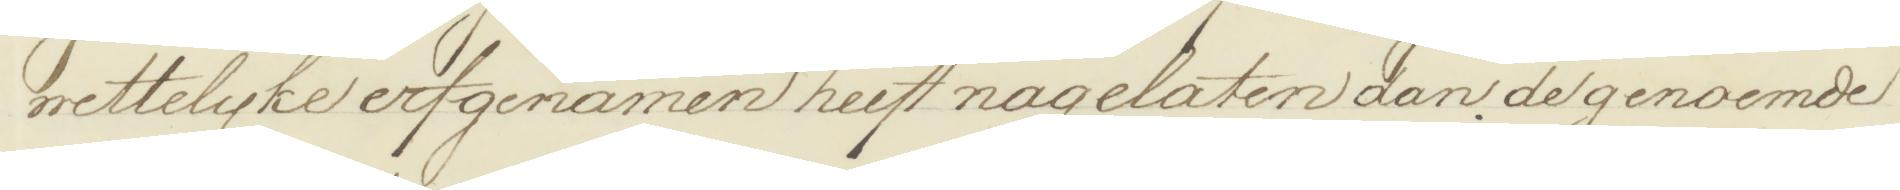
wettelyke erfgenamen heeft nagelaten dan. de genoemde
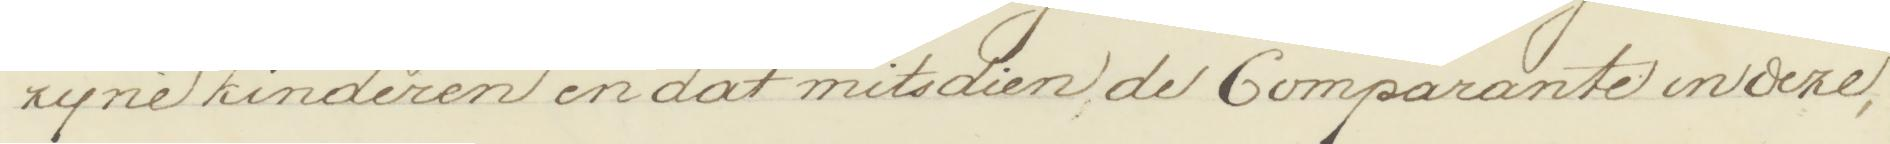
zyne kinderen en dat mitsdien, de Comparante in deze,
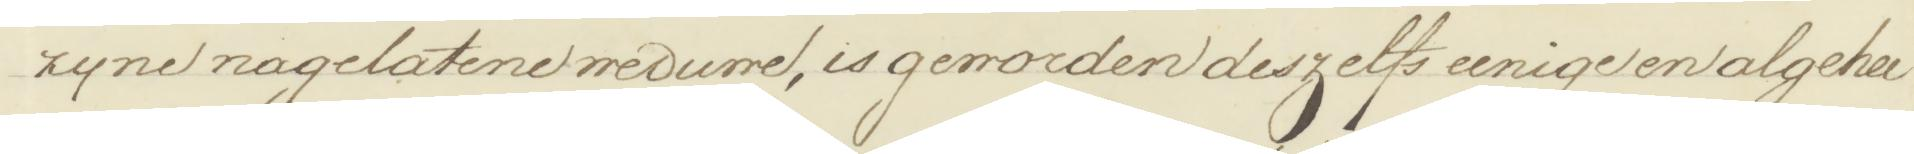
zyne nagelatene weduwe, is geworden deszelfs eenige en algehee„
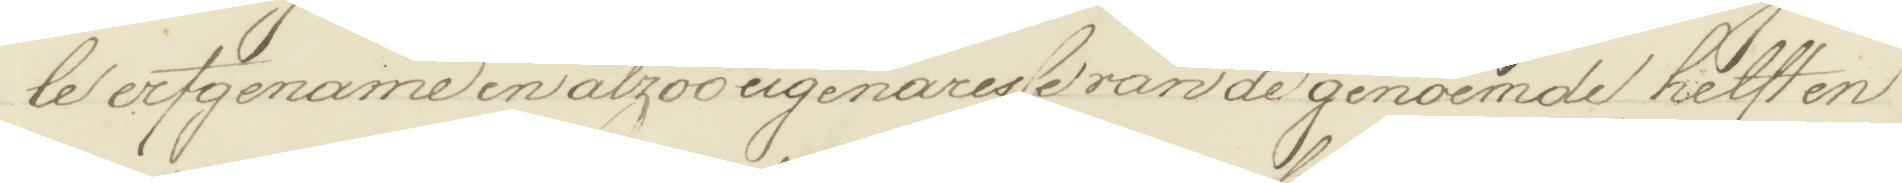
le erfgename en alzoo eigenaresse van de genoemde helft en
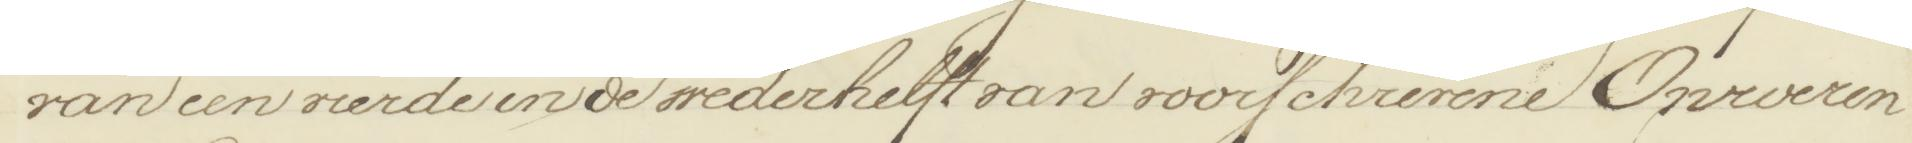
van een vierde in de wederhelft van voorschrevene Onroeren
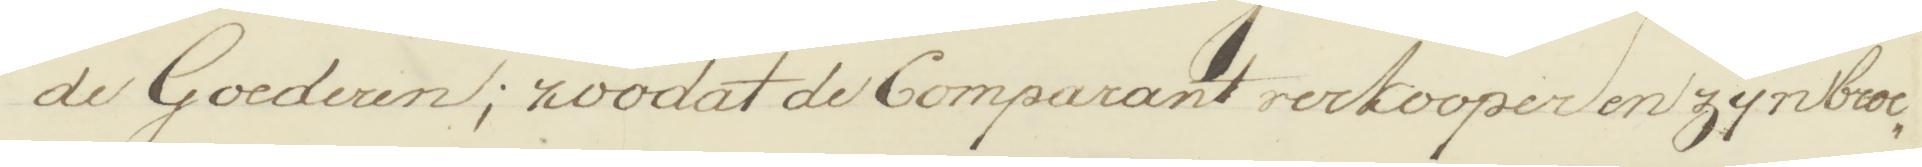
de Goederen; zoodat de Comparant verkooper en zyn broe„
